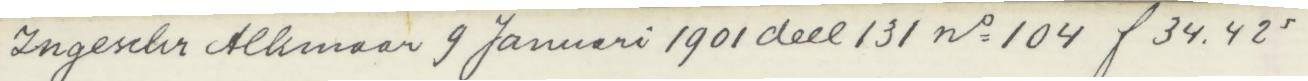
Ingeschr Alkmaar 9 Januari 1901 deel 131 n=o 107 ƒ 37.425
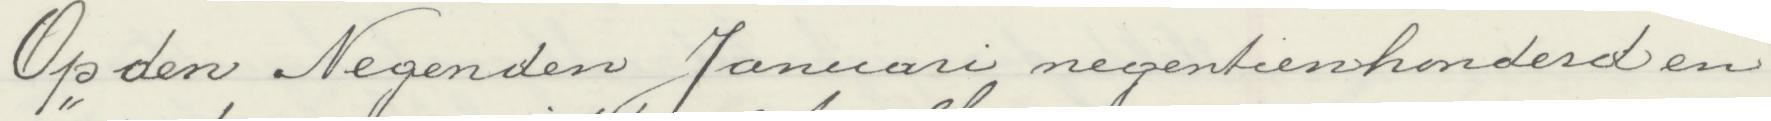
Op den Negenden Januari negentienhonderd en
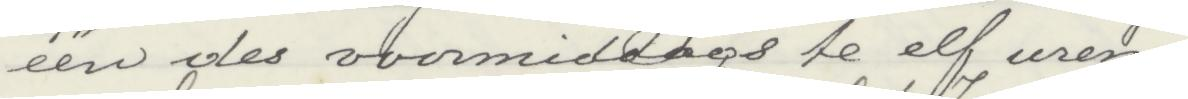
één des voormiddags te elf uren.
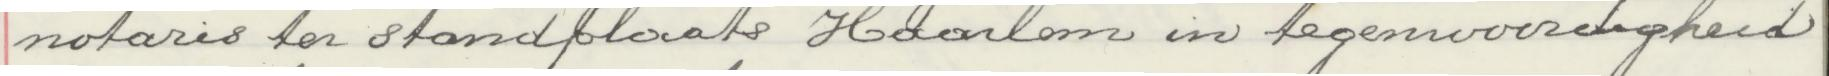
notaris ter standplaats Haarlem in tegenwoordigheid
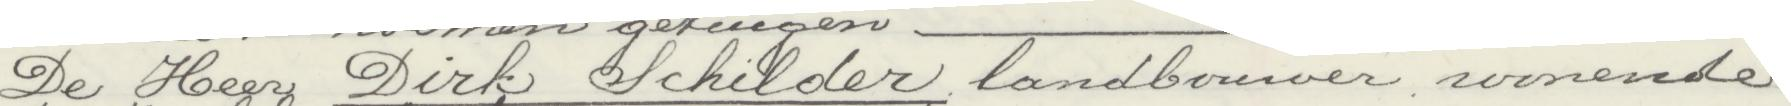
De Heer Dirk Schilder landbouwer, wonende
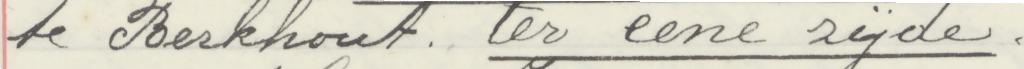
te Berkhout, ter eene zyde.
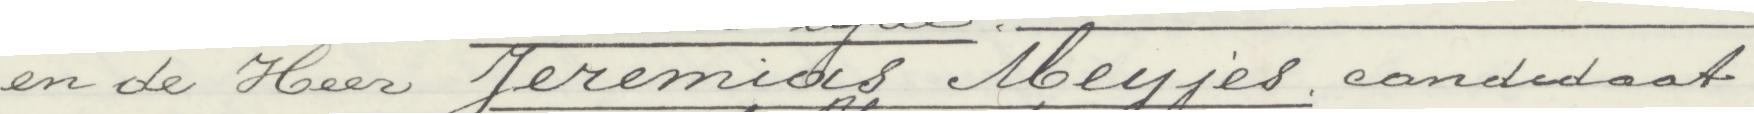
en de Heer Jeremias Meyjes, candidaat
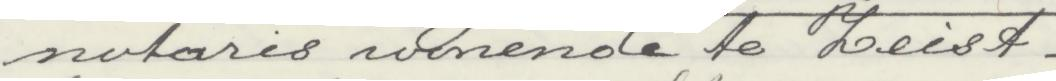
notaris wonende te Zeist
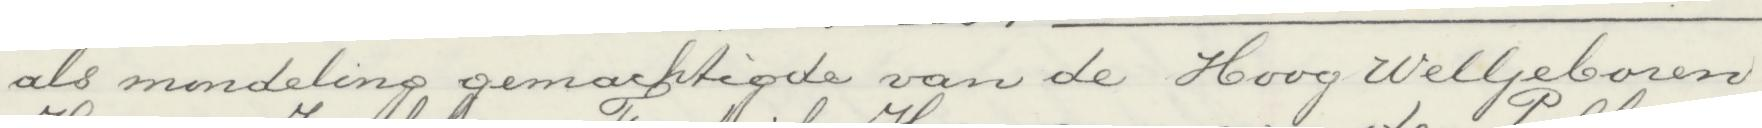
als mondeling gemachtigde van de Hoog Wel Geboren
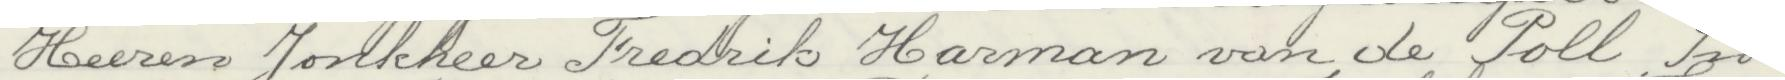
Heeren Jonkheer Fredrik Harman van de Poll, In
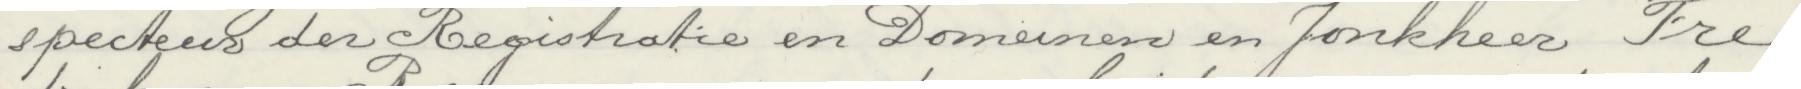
specteur der Registiatie en Domeinen en Jonkheer Fre
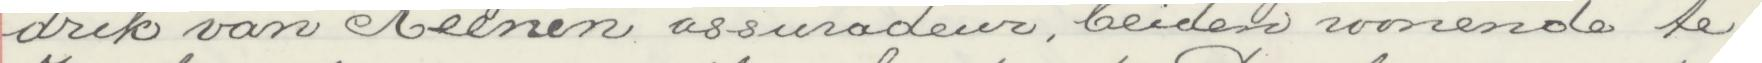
drik van Reenen assuradeur, beiden wonende te
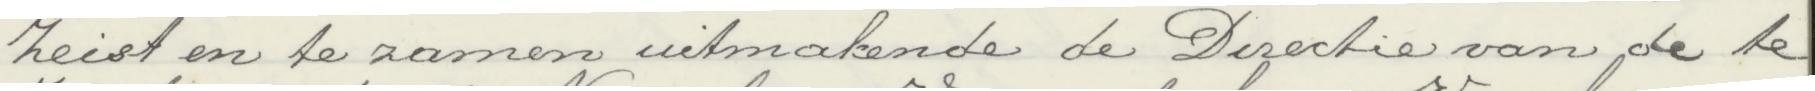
Zeist en te zamen uitmakende de Directie van de te
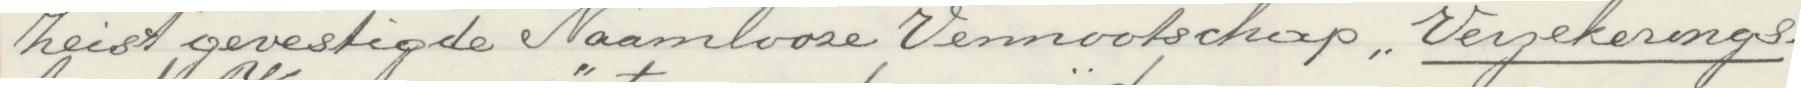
Zeist gevestigde Naamlooze Vennootschap „ Verzekerings
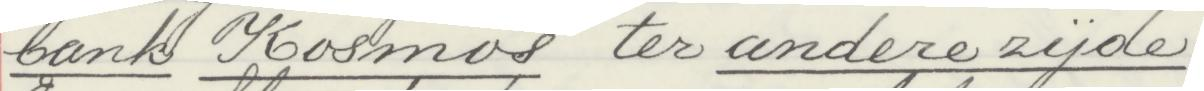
bank Kosmos " ter andere zijde
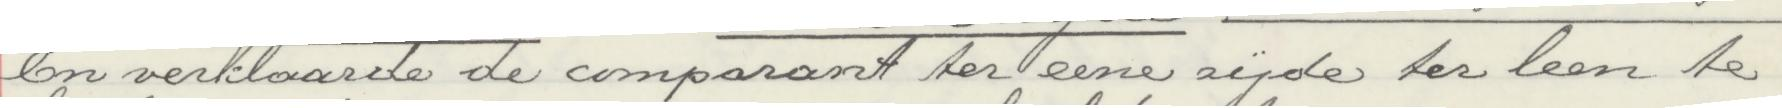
En verklaarde de comparant ter eene zijde ter leen te
